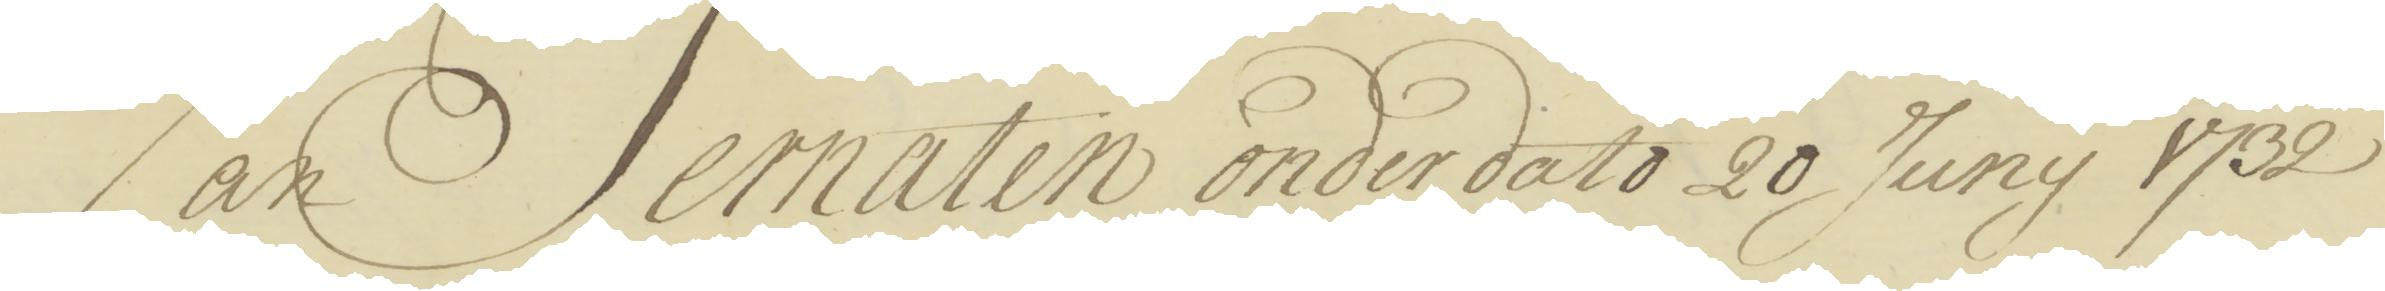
Van Ternaten onder dato 20 Juny 1732
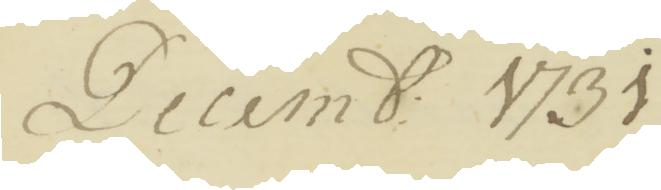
Decemb: 1731
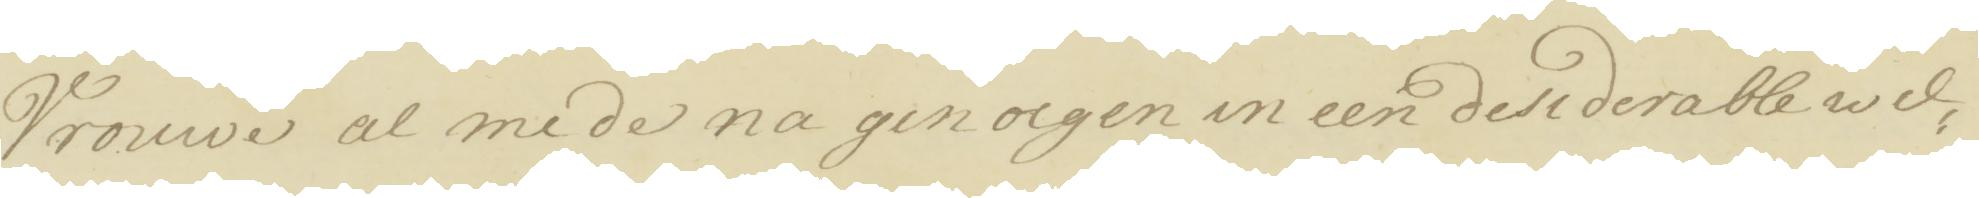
Vrouwe al mede na genoegen in een desiderable wel„
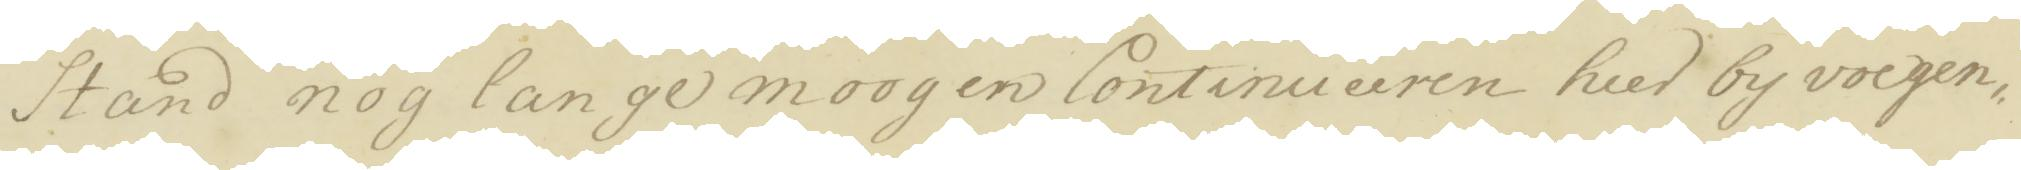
Stand nog lange moogen Continueeren hier by voegen„
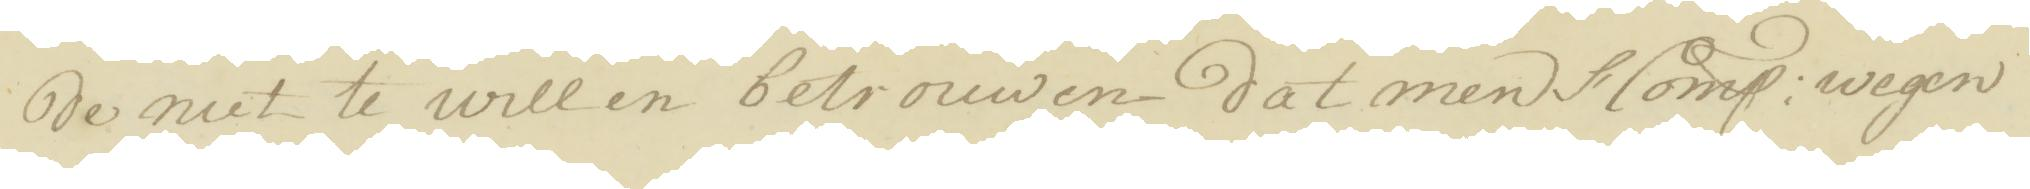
de niet te willen betrouwen dat men S'Comp: wegen
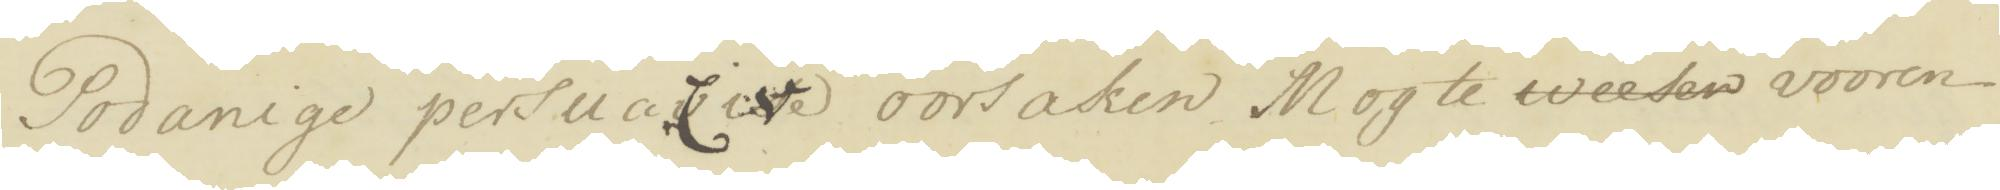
Sodanige persuacive oorsaken Mog te weesen vooren
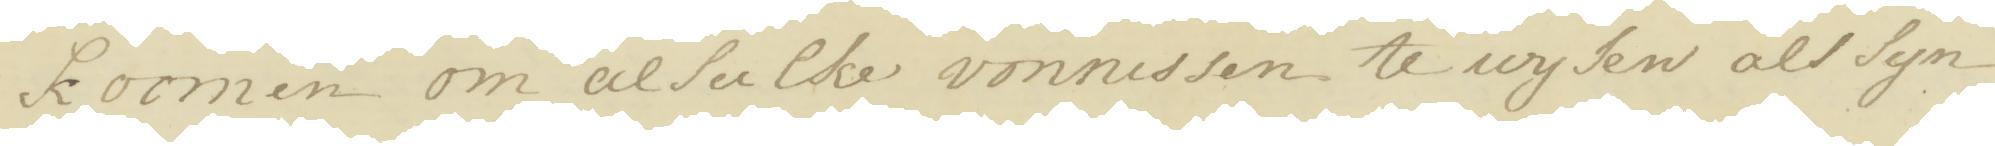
koomen om al Sulke vonnissen te wysen als Syn
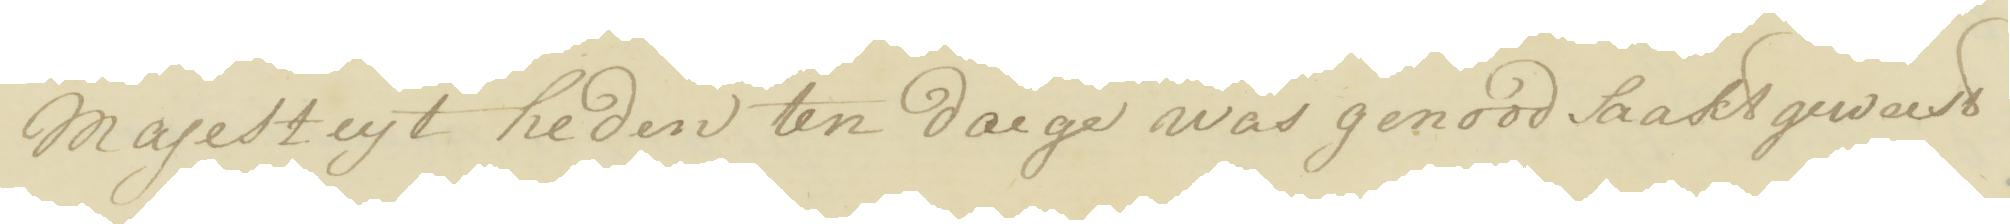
Majesteyt heden ten daege was genoodsaakt geweest
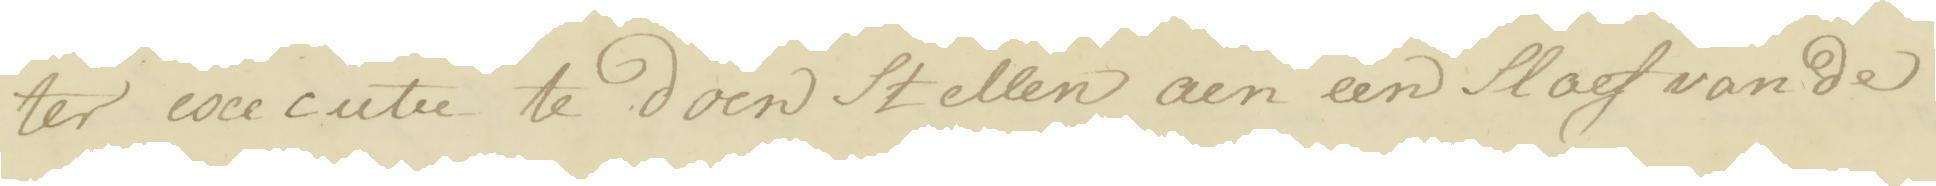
ter excecutie te doen Stellen aen een Slaef van de
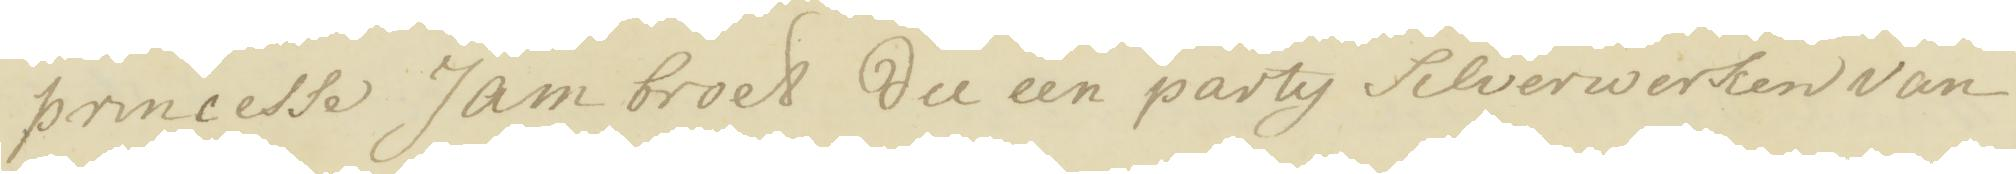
princesse Jam broet die een party Silverwerken van
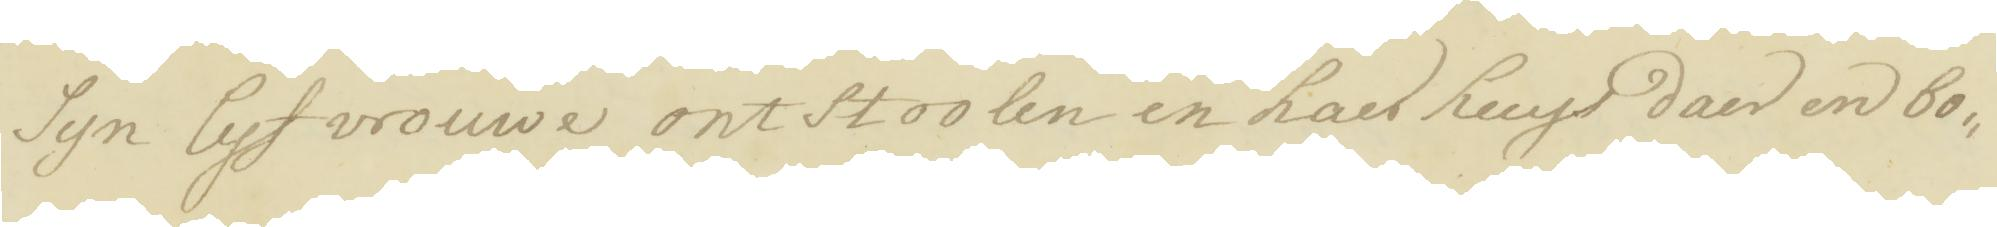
Syn lyfvrouwe ontstoolen en haer huys daer en bo„
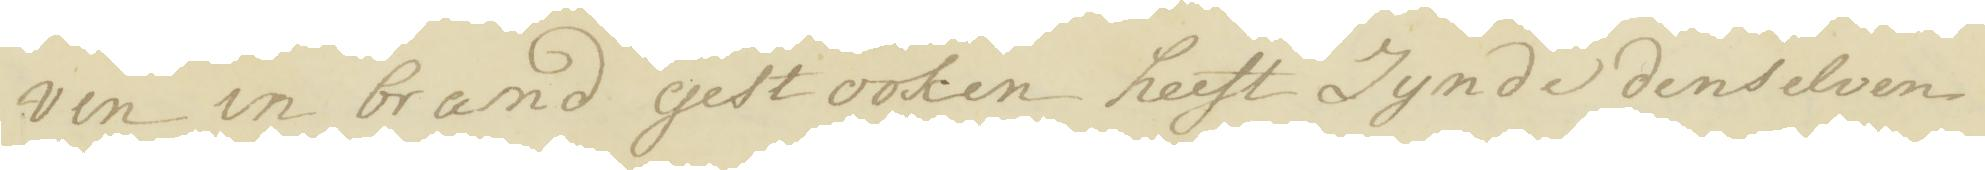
ven in brand gestooken heeft Zynde denselven
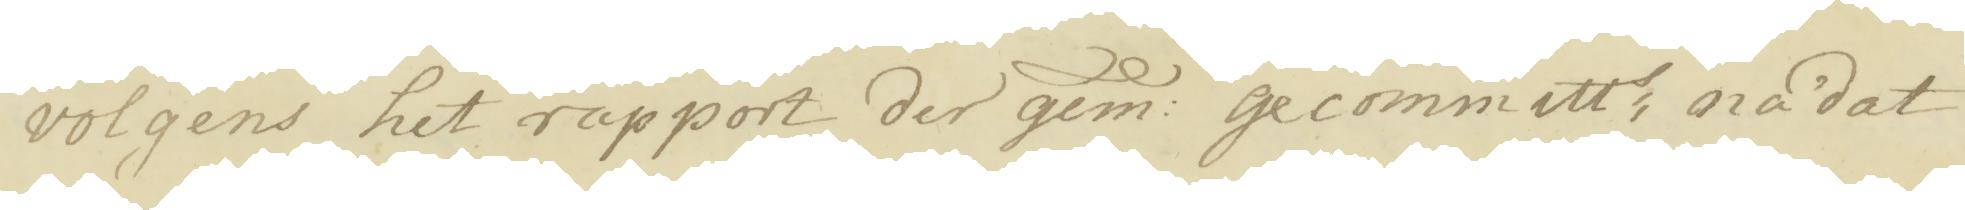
volgens het rapport der gem: gecommitt„s na dat
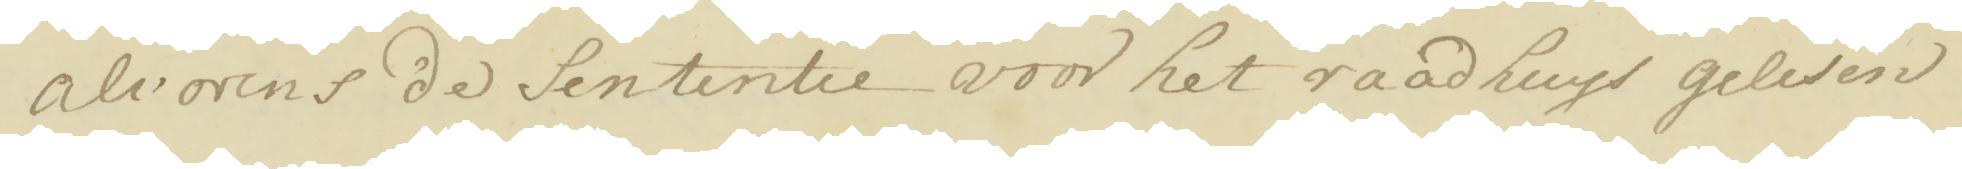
alvorens de sententie voor het raadhuys gelesen
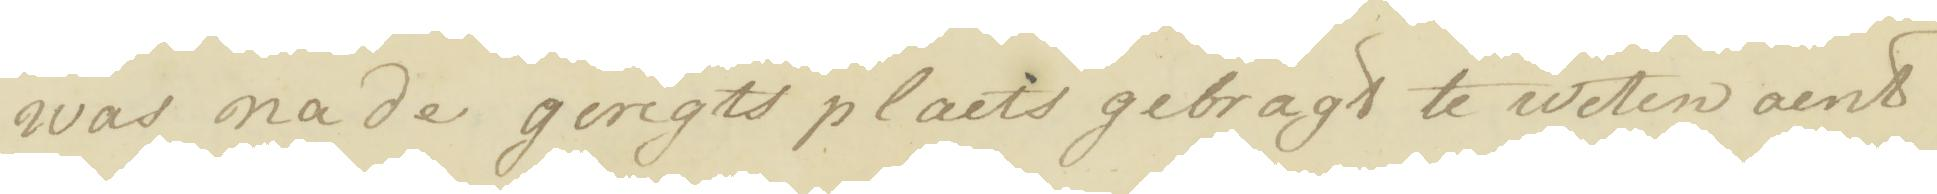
was na de gerigts plaets gebragt te weten aent
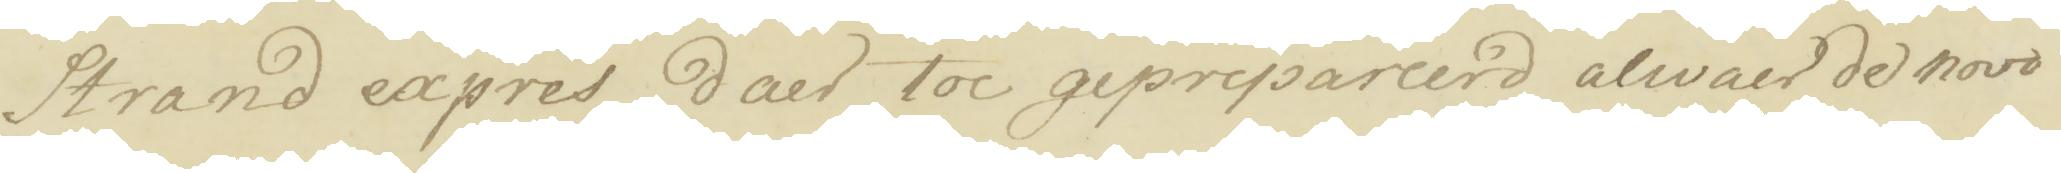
Strand expres daer toe geprepareerd alwaer de novo
